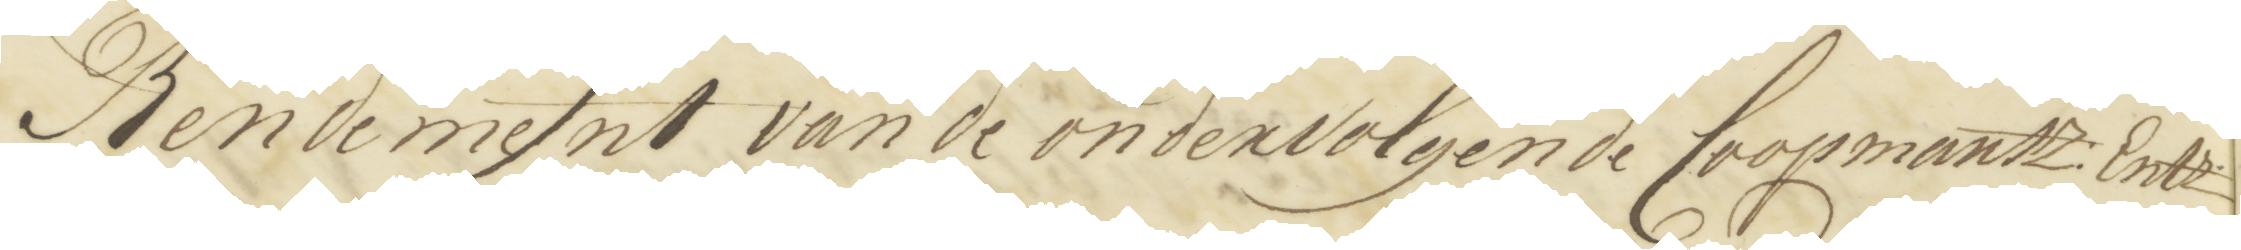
Rendement van de ondervolgende Coopmansz: Entz
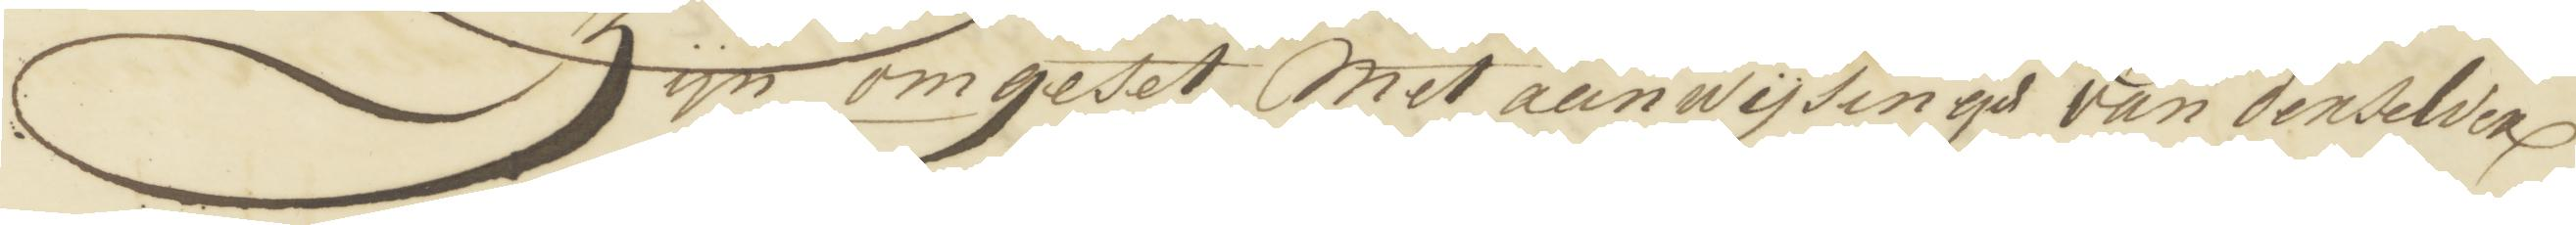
Zijn omgeset met aanwijsinge van derselver
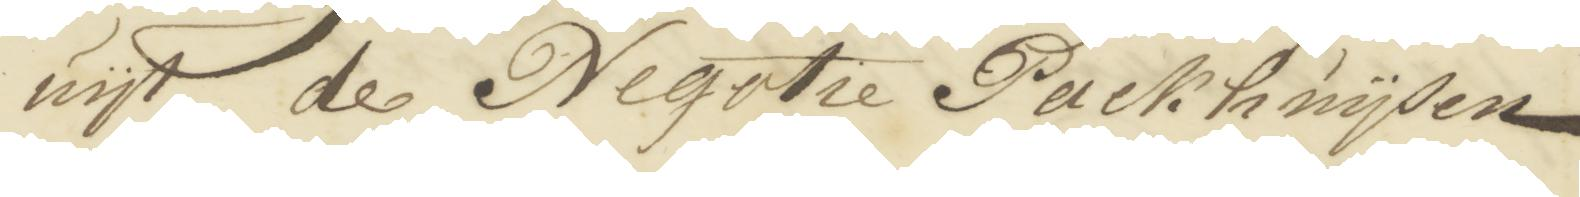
uijt de Negotie Packhuijsen
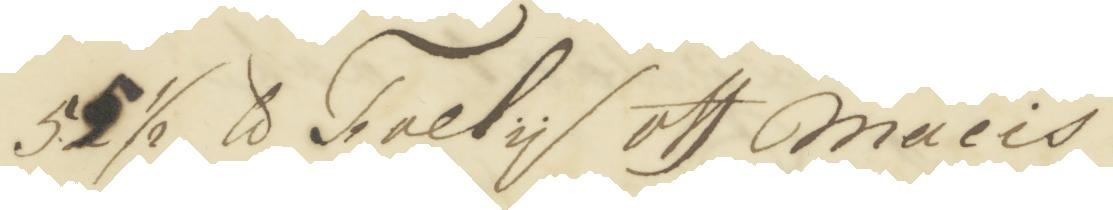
55½ lb Foelij off macis
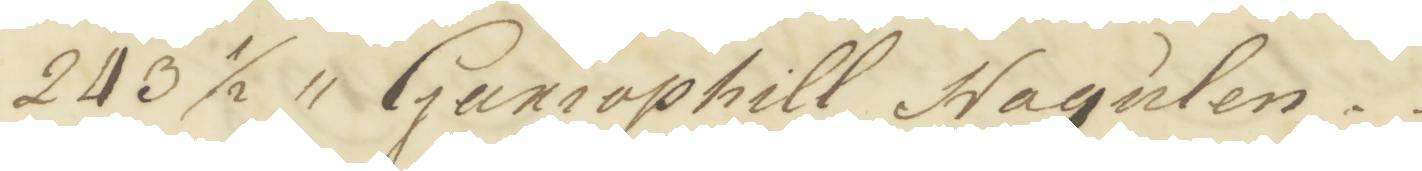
243½ „ Garrophill Nagulen
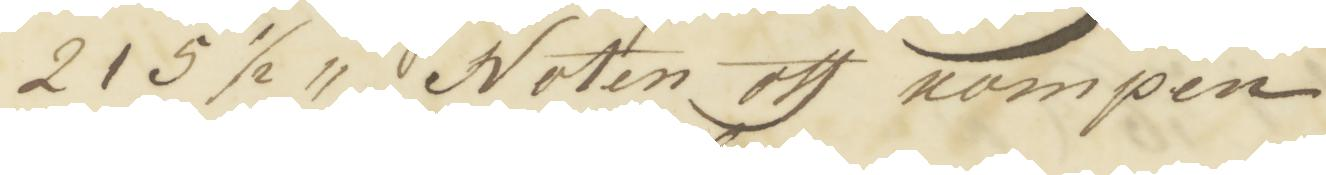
215½ „ Noten off rompen
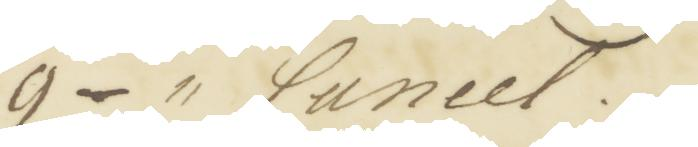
9 — „ Caneel .
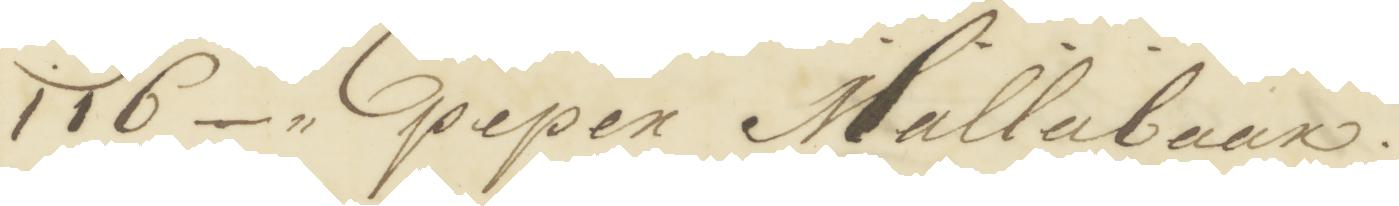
116 — „ peper Mallabaar
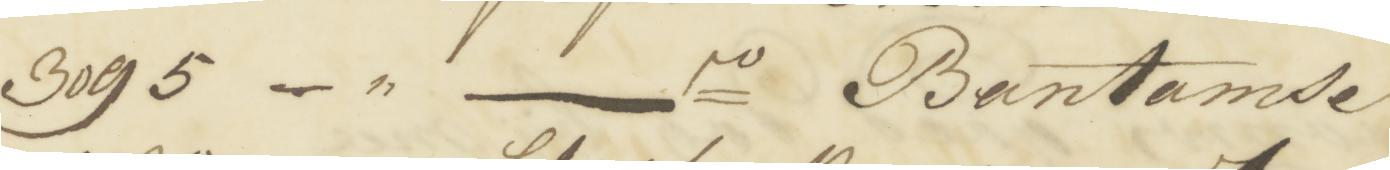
3095 — „ _=o Bantamse
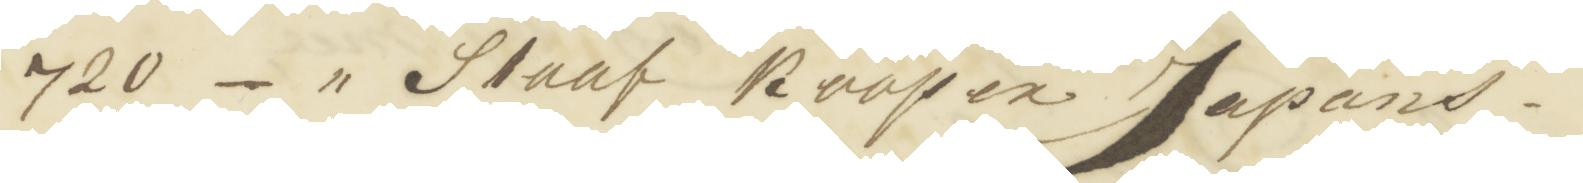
720 — „ staaf kooper Japans -
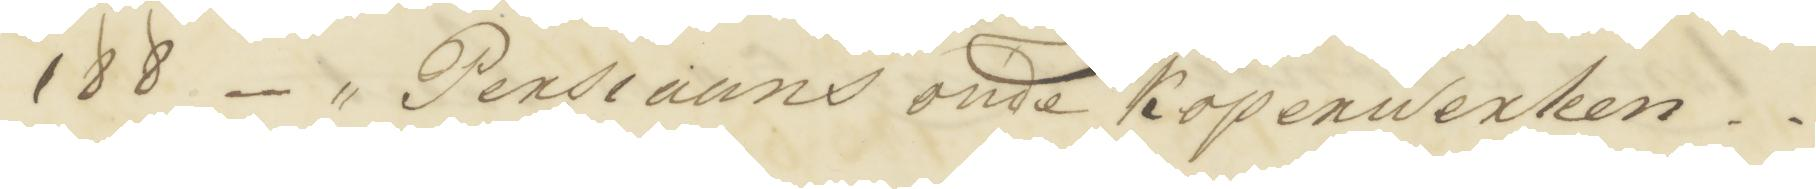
188 — „ Persiaans oude koperwerken - -
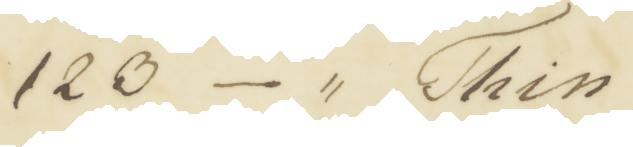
123 — „ Thin
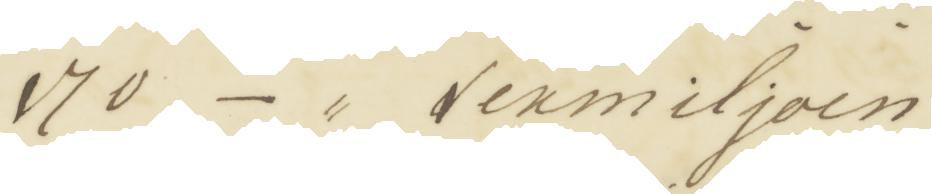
170 — „ vermiljoen
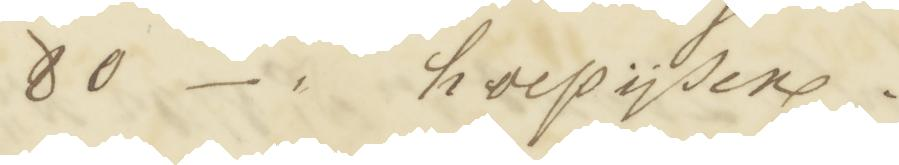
80 — „ hoepijser
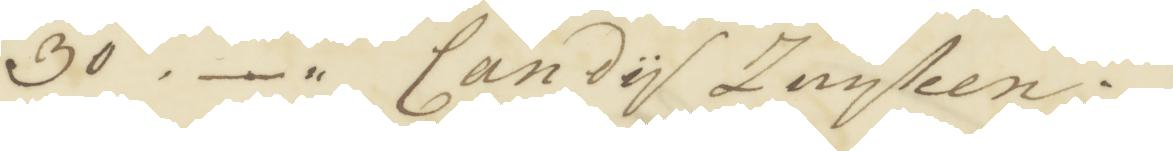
30 , — „ Candij zuijker -
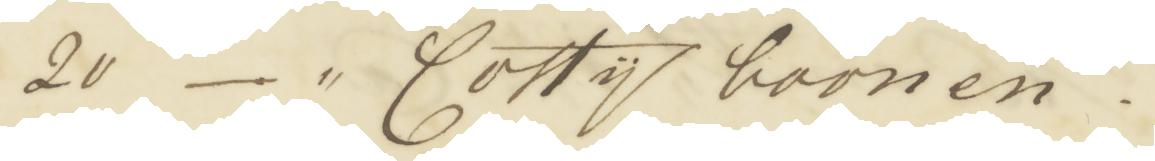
20 — „ Coffij boonen -
